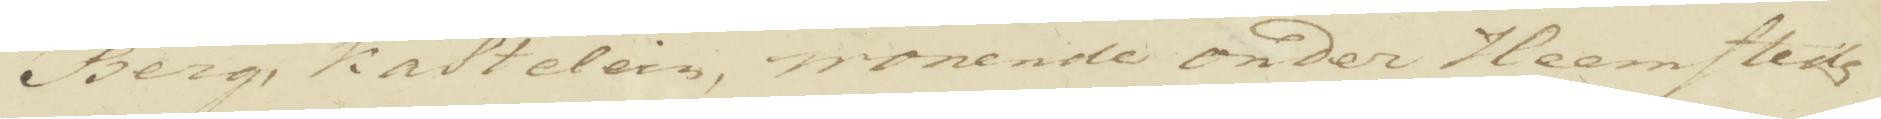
Berg, kastelein, wonende onder Heemstede
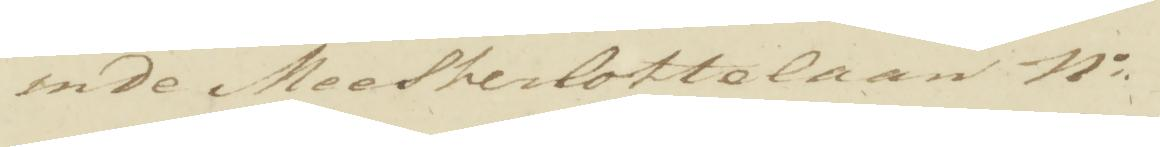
in de Meesterlottelaan N:o . voor eene
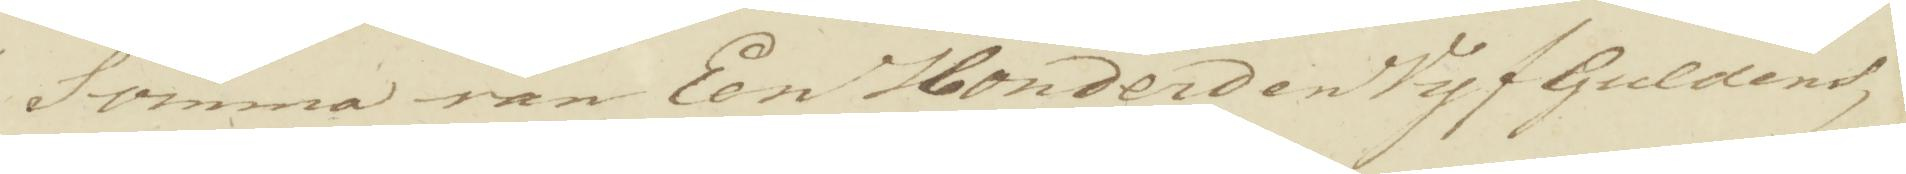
somma van Een Honderd en Vyf Guldens,
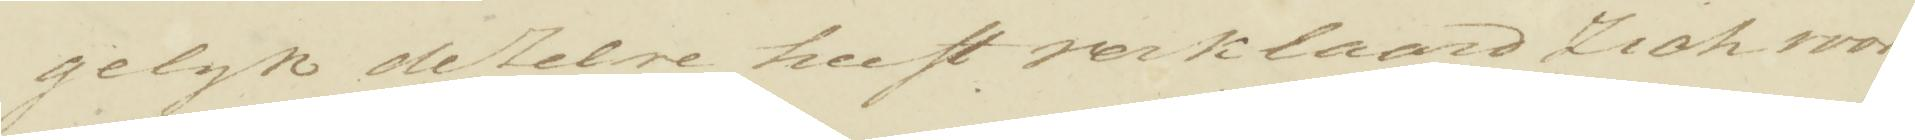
gelyk dezelve heeft verklaard zich voor
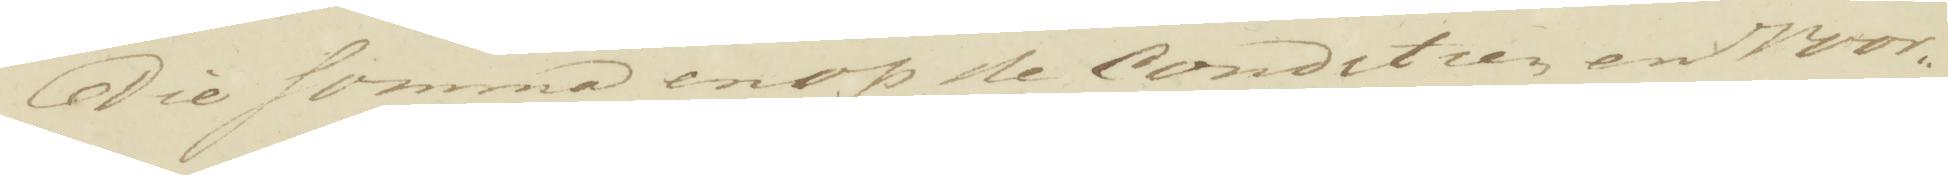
die somma en op de conditien en voor„
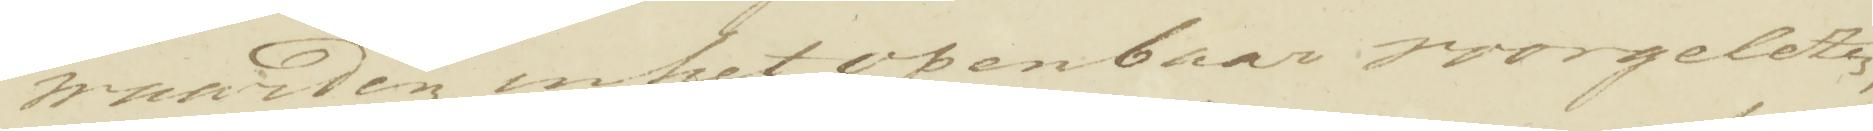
waarden in het openbaar voorgelezen,
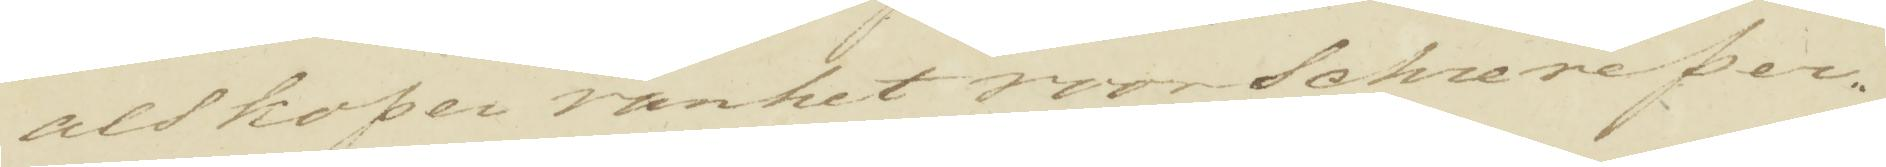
als koper van het voorschreve per„
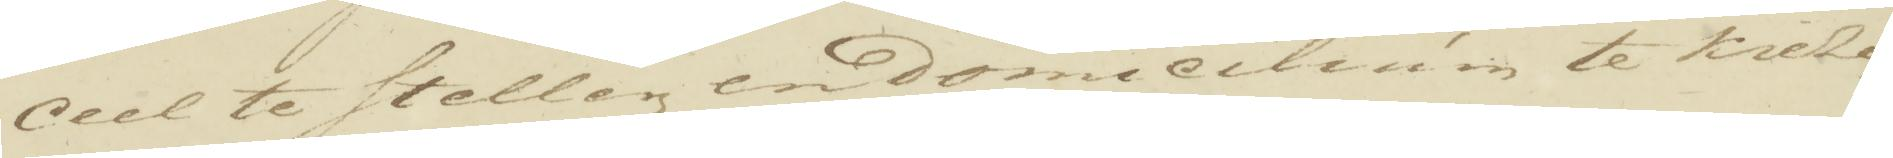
ceel te stellen, en domicilium te kiezen
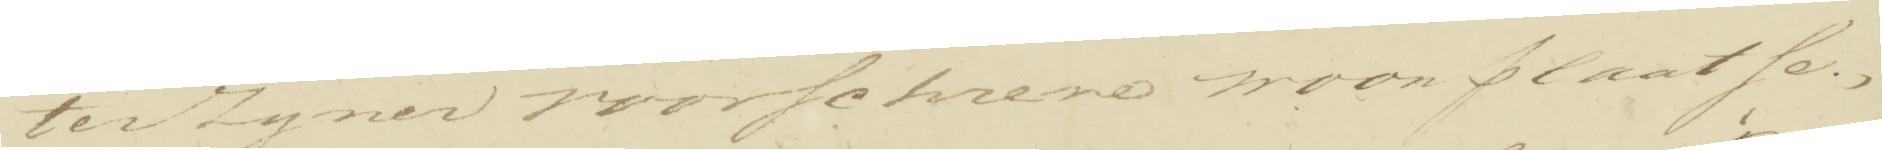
ter zyner voorschreve woonplaatse.
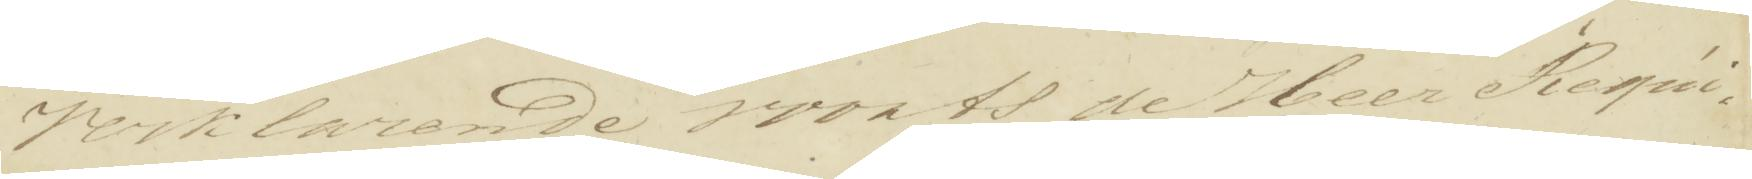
verklarende voorts de Heer Requi„
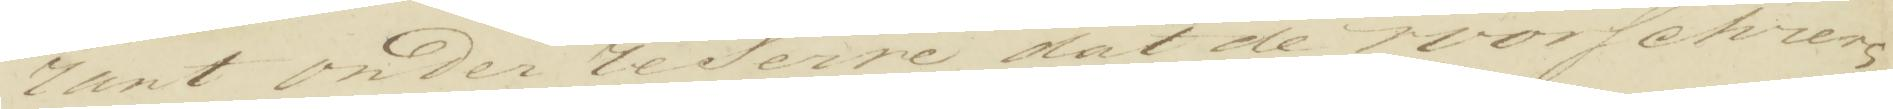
rant onder reserve dat de voorschreven
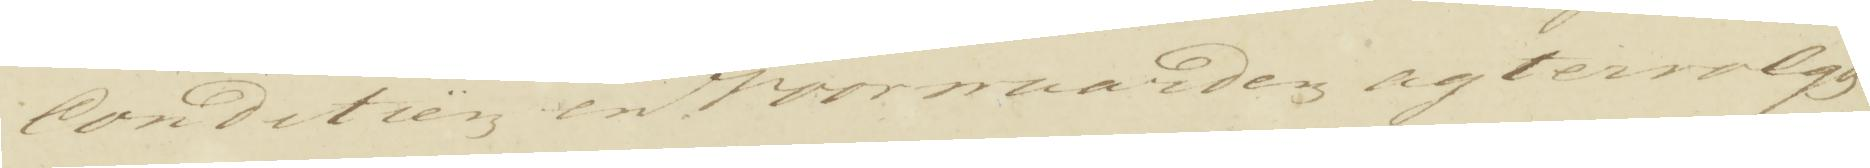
conditien en voorwaarden agtervolgen
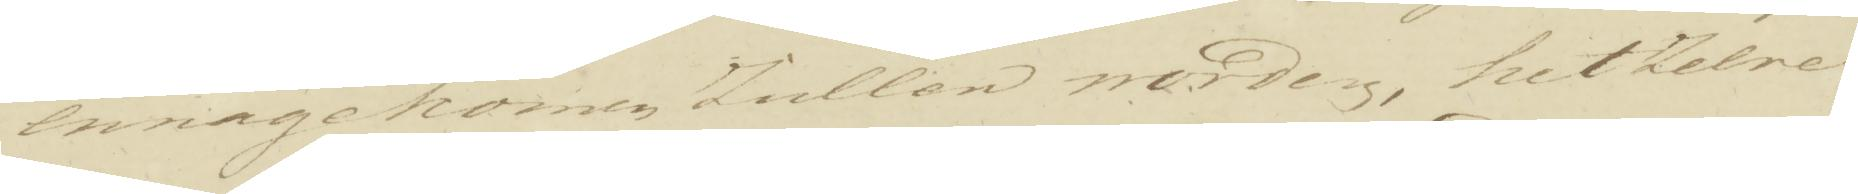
en nagekomen zullen worden, hetzelve
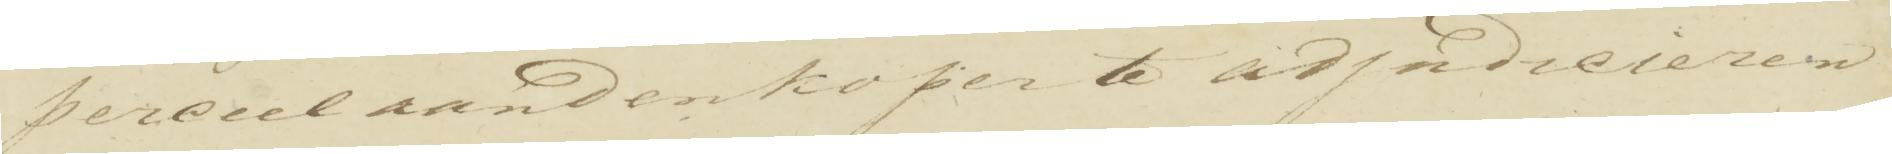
perceel aan den koper te adjudicieren
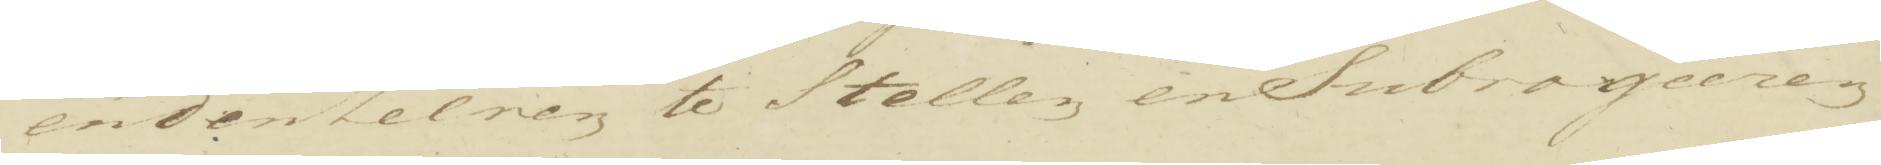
en den zelven te stellen en subrogeeren
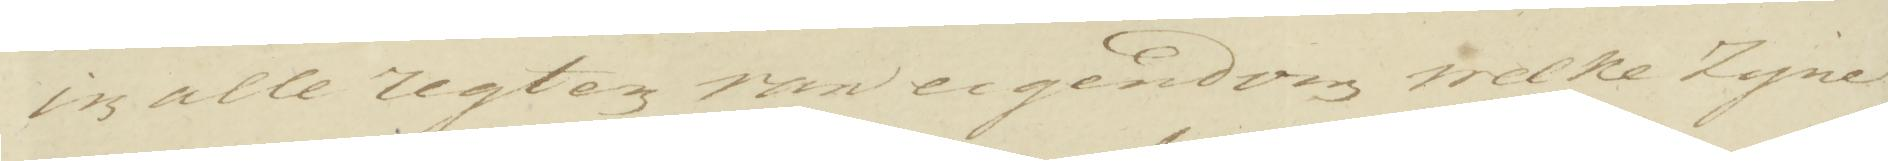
in alle regten van eigendom welke zyne
